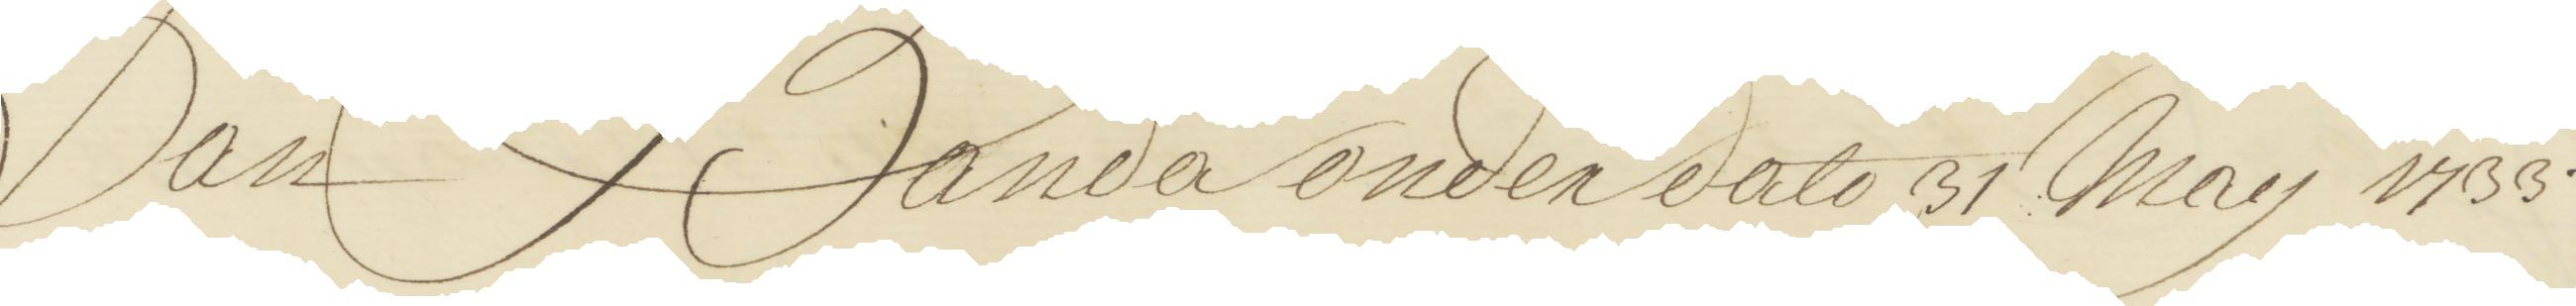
Van Banda onder dato 31:' Maij 1733
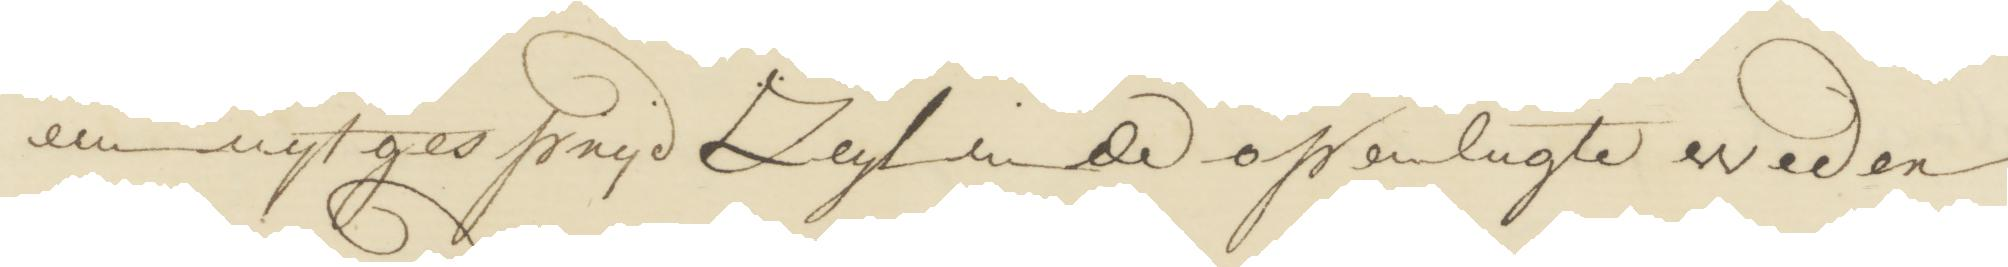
een uijt gesprijd Zeyl in de open lugte weder
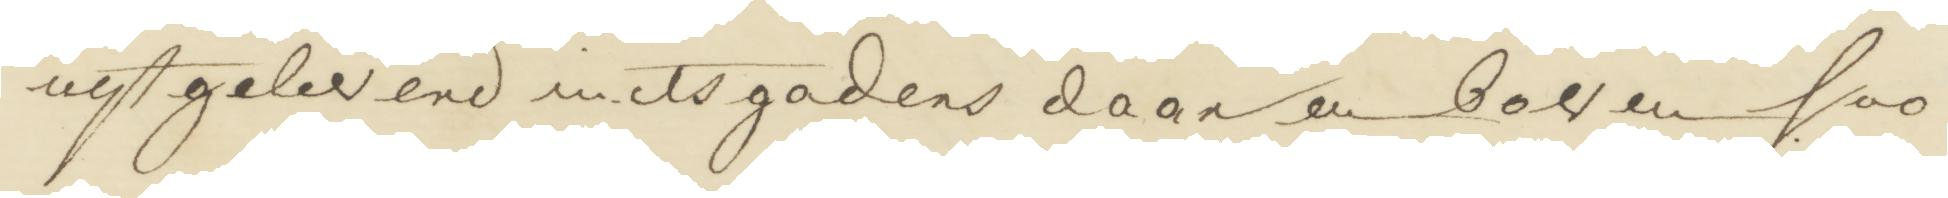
uijt geleverd, mitsgaders daar en boven soo
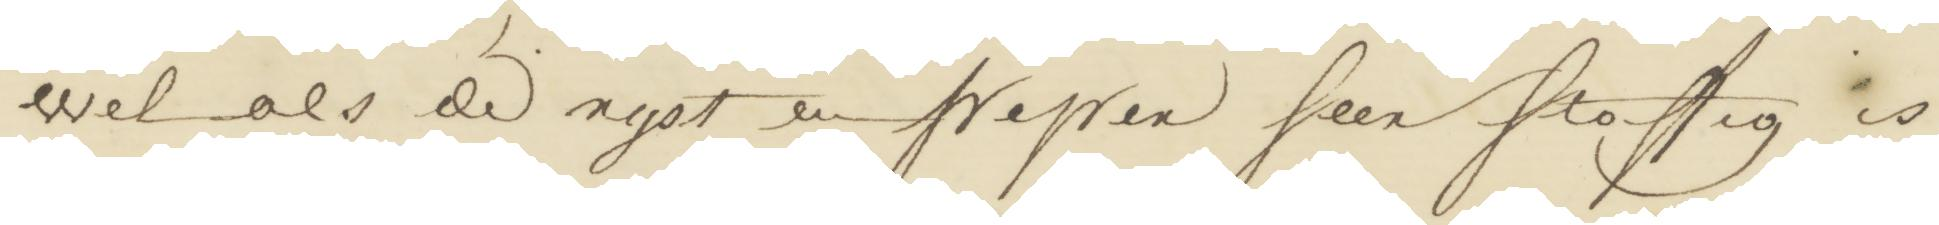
wel als de rijst en peper seer stoffig is
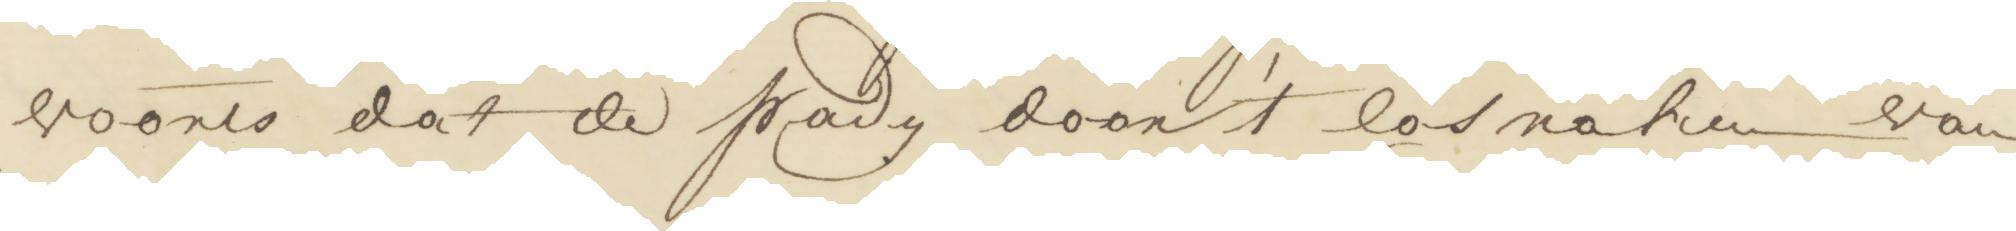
voorts dat de padij door ’t los raken van
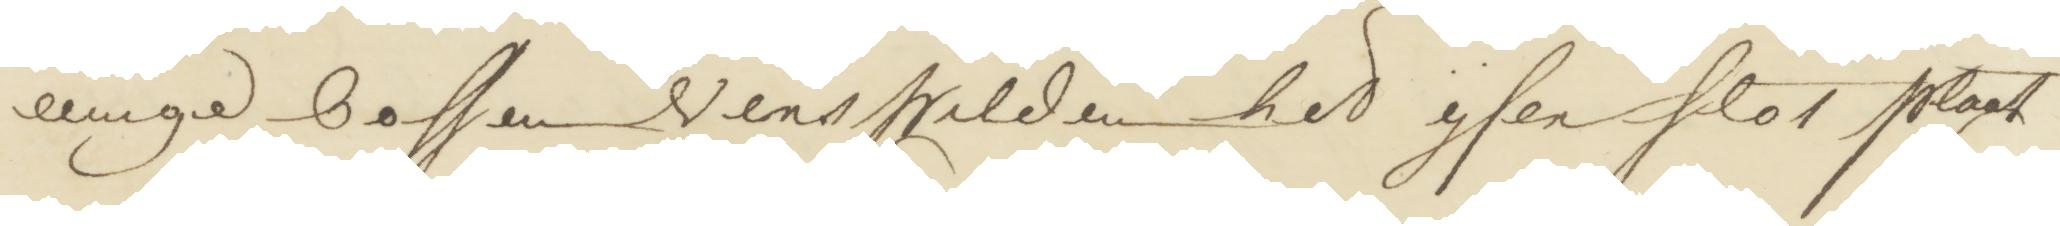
eenige bossen verspilden het ijser slot plaat
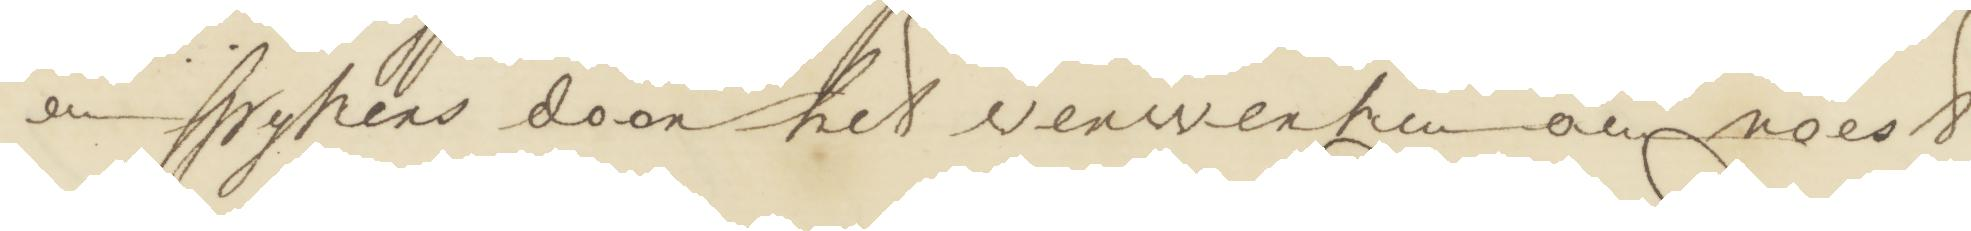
en spijkers door het verwerken om roest
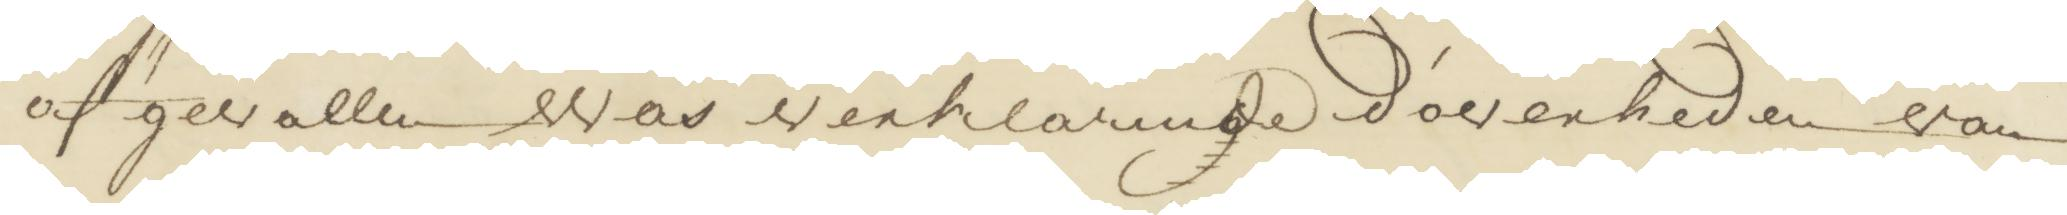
afgevallen was verklarende d'overheden van
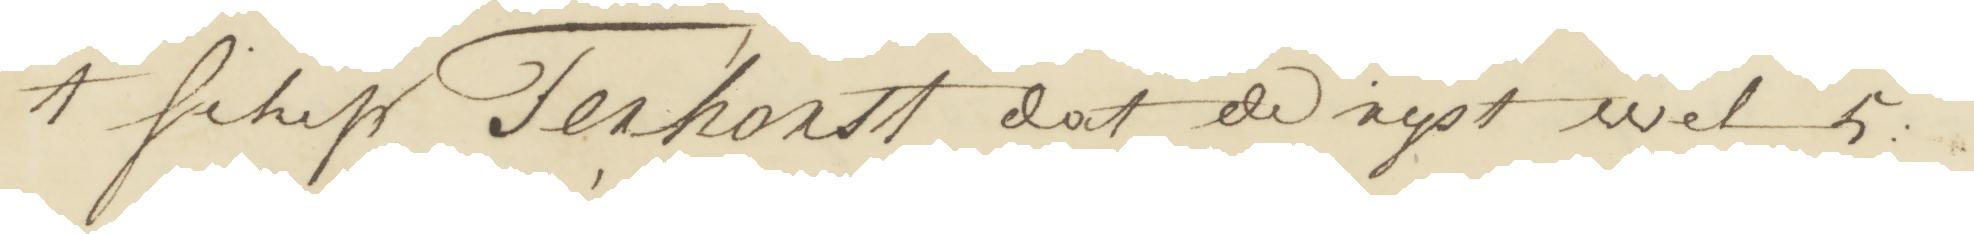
't schip Terhorst dat de rijst wel 5:'
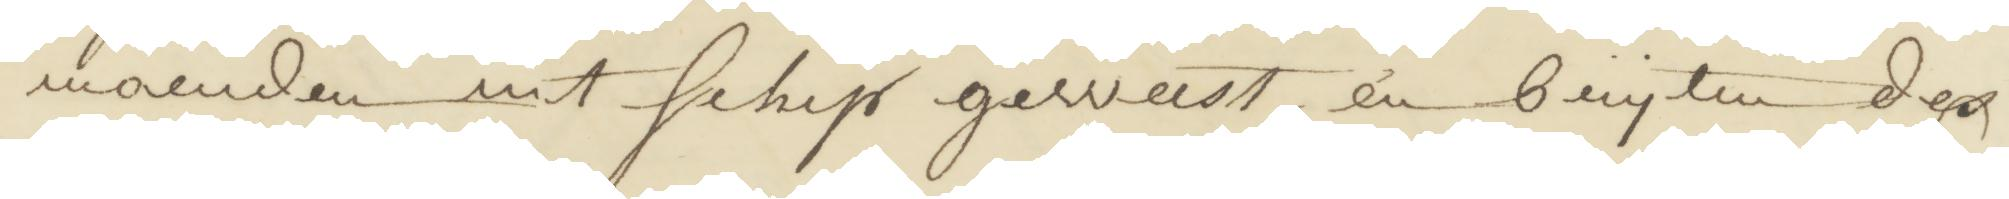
moenden in 't schip geweest en buijten des
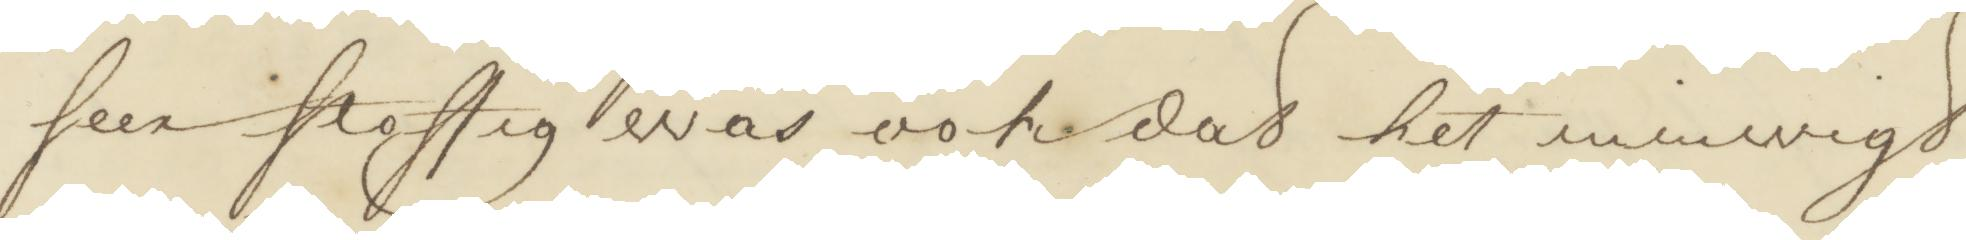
seer stoffig was, ook dat het minwigt
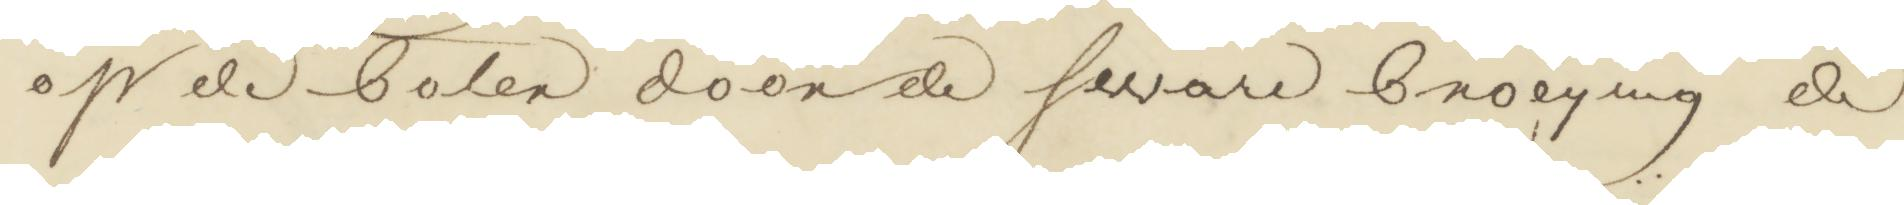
op de boter, door de sware broeijing de
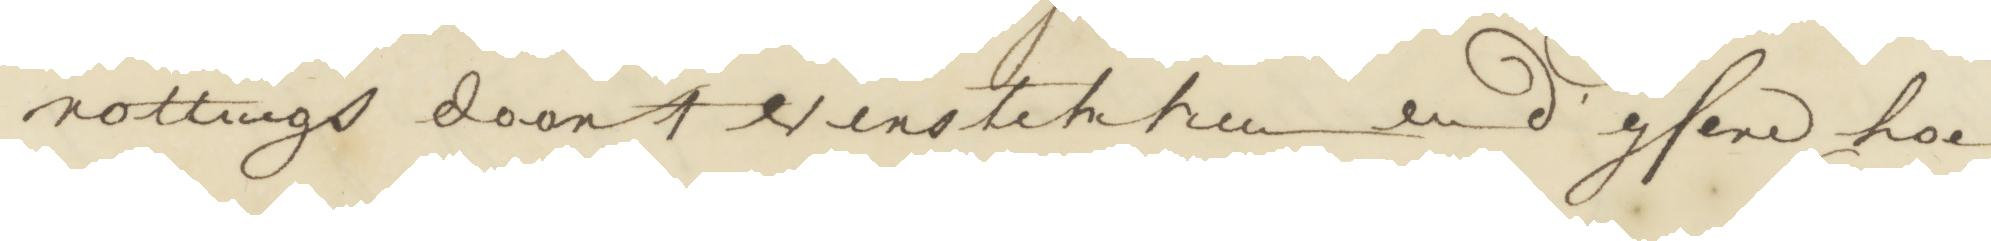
rottings door t verstikken en d’ ijsere hoe
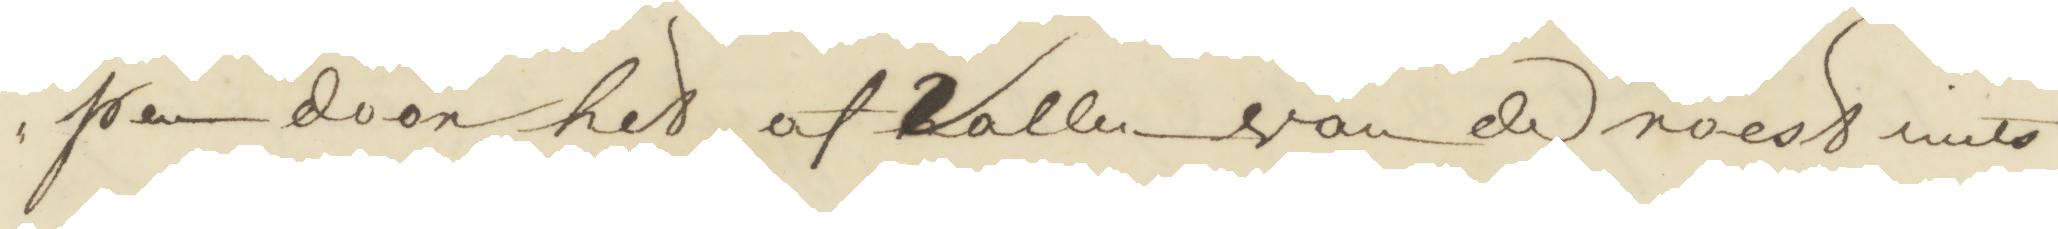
„pen door het af vallen van de roest mits
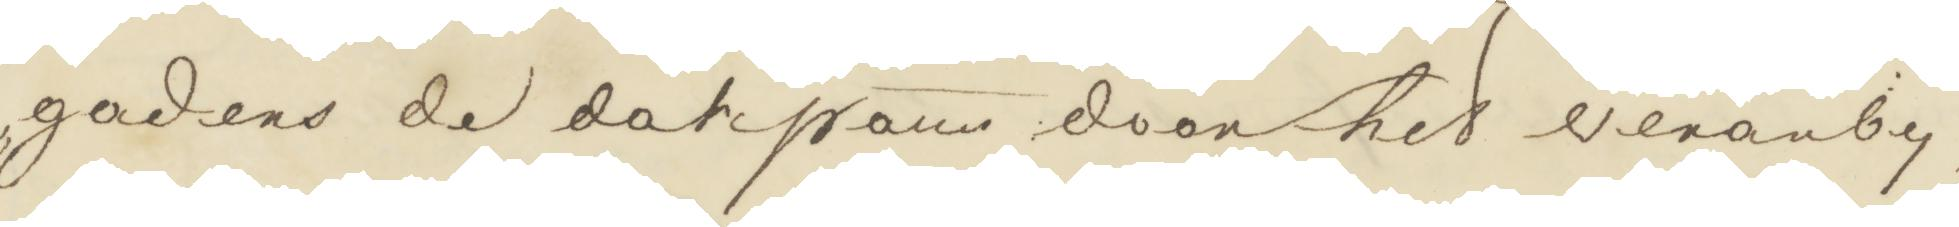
„gaders de dakpans door het verarbij
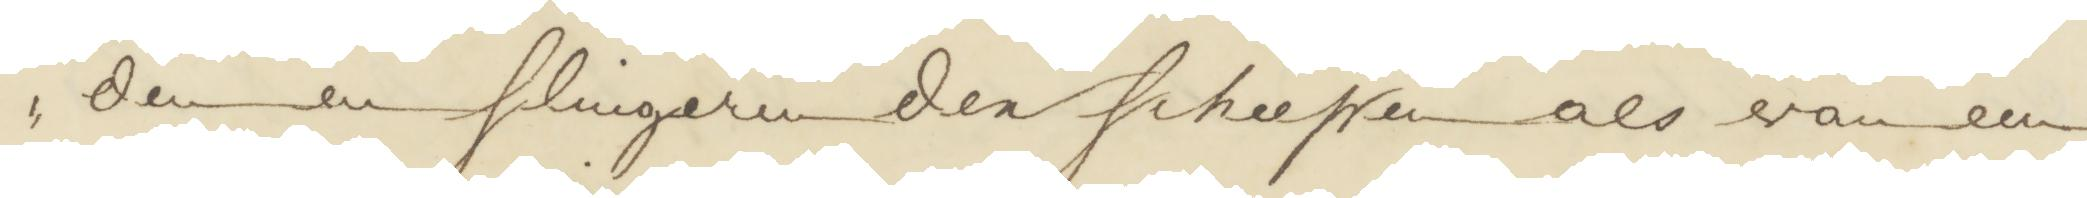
„den en slingeren der scheepen als van een
